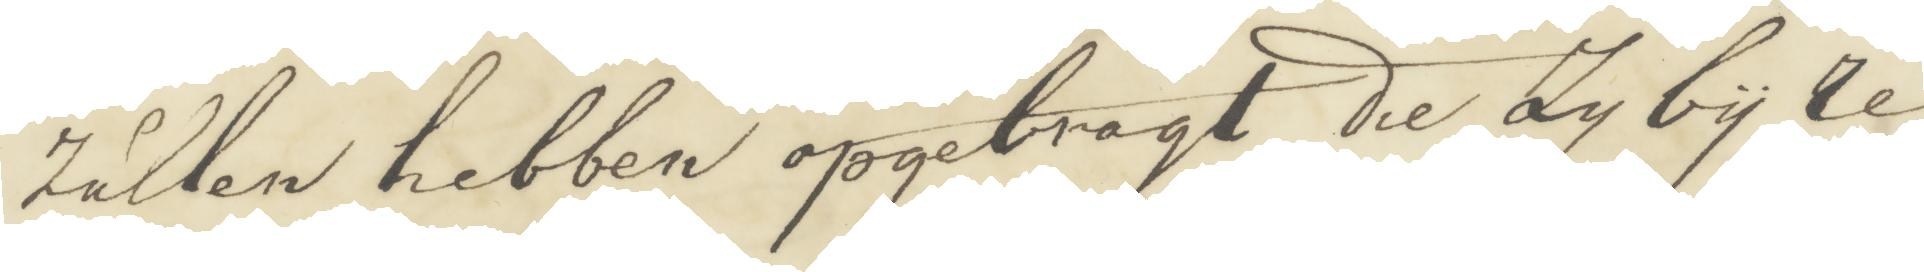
zullen hebben opgebragt, die zy bij re
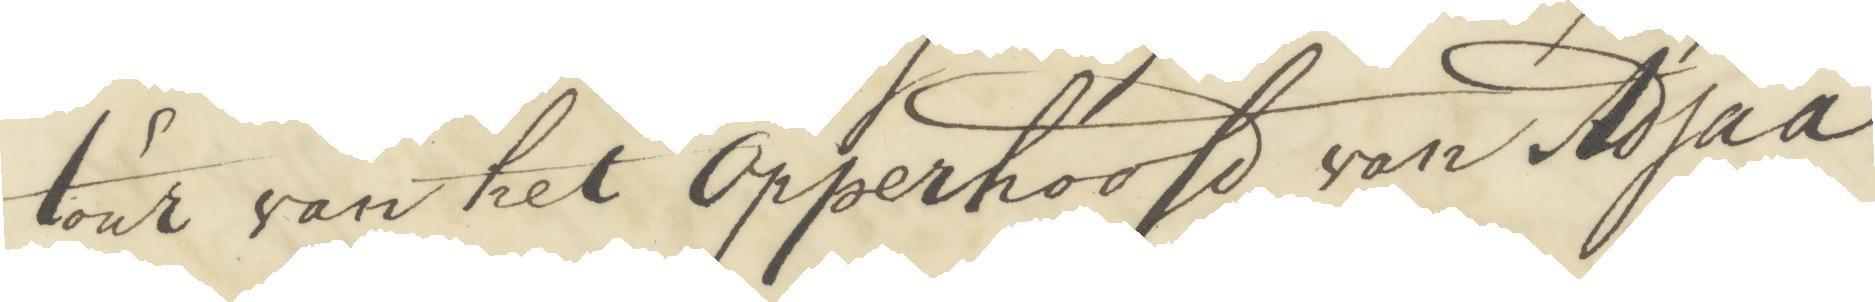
tour van het Opperhoofd van Adjaa
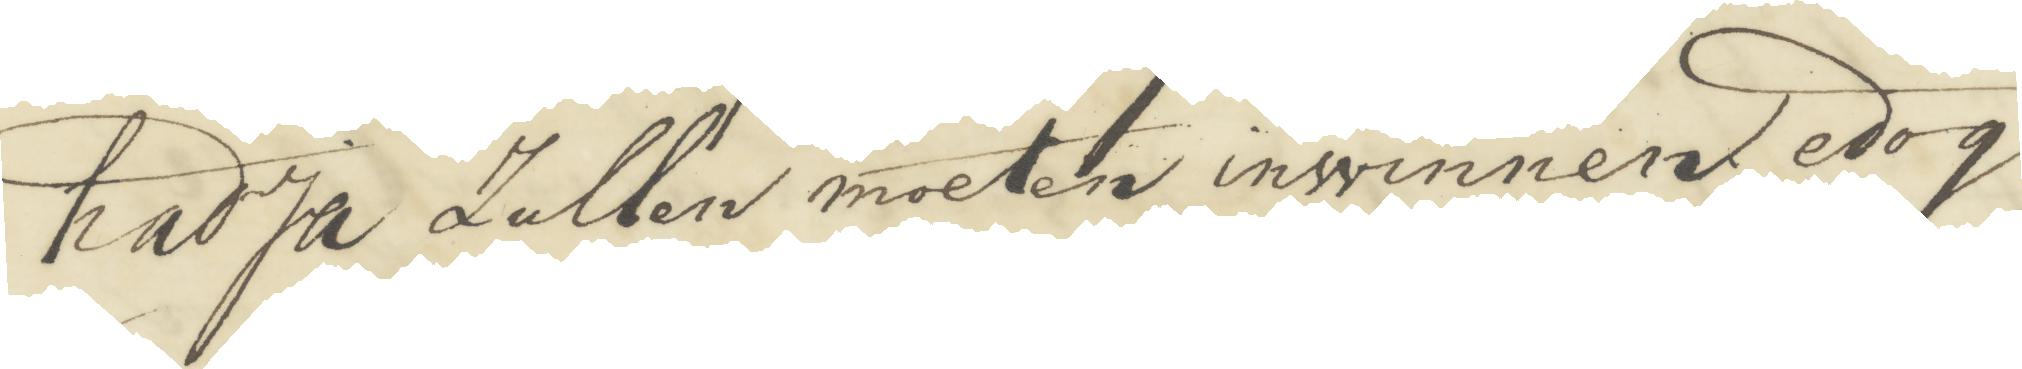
hadja zullen moeten inwinnen, edog
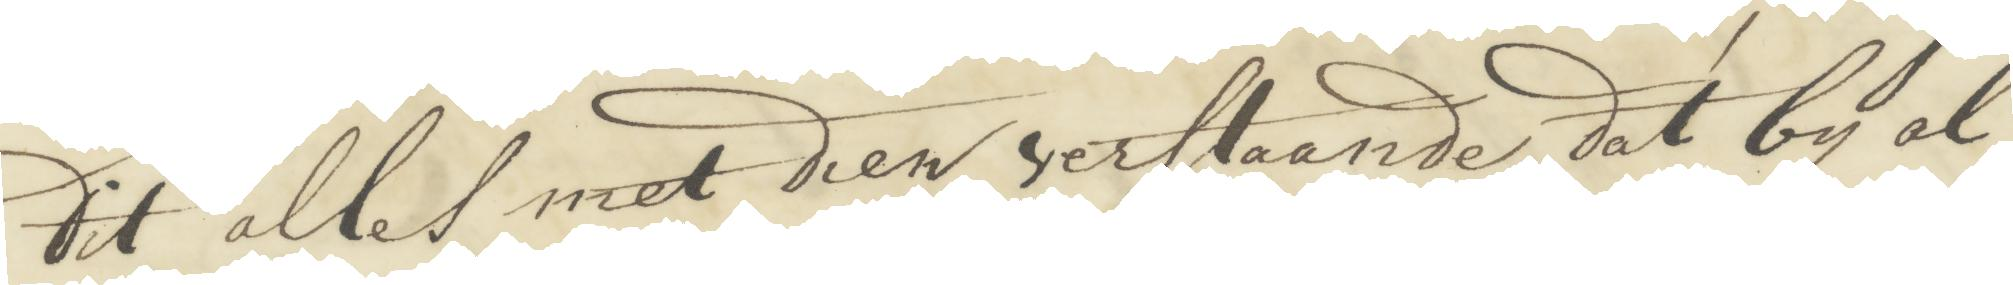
dit alles met dien verstaande, dat by al
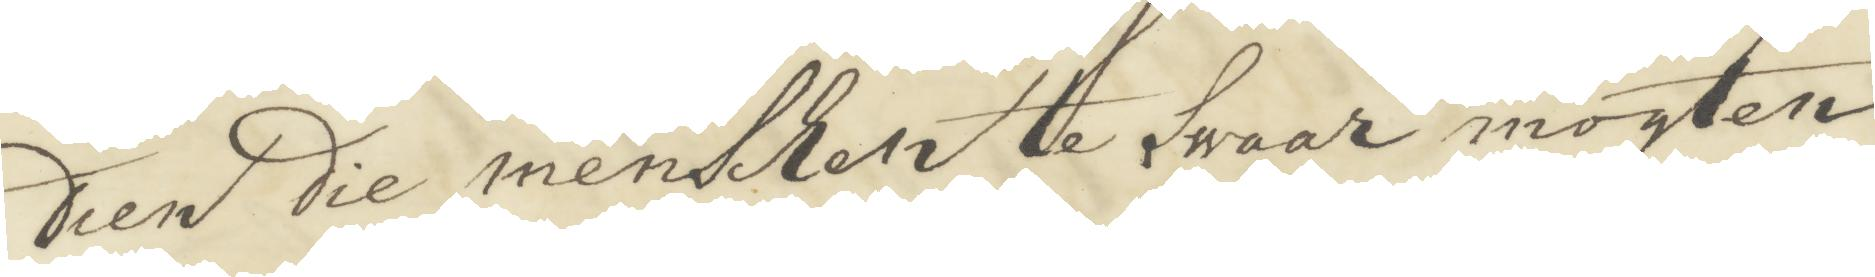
dien die menschen te swaar mogten
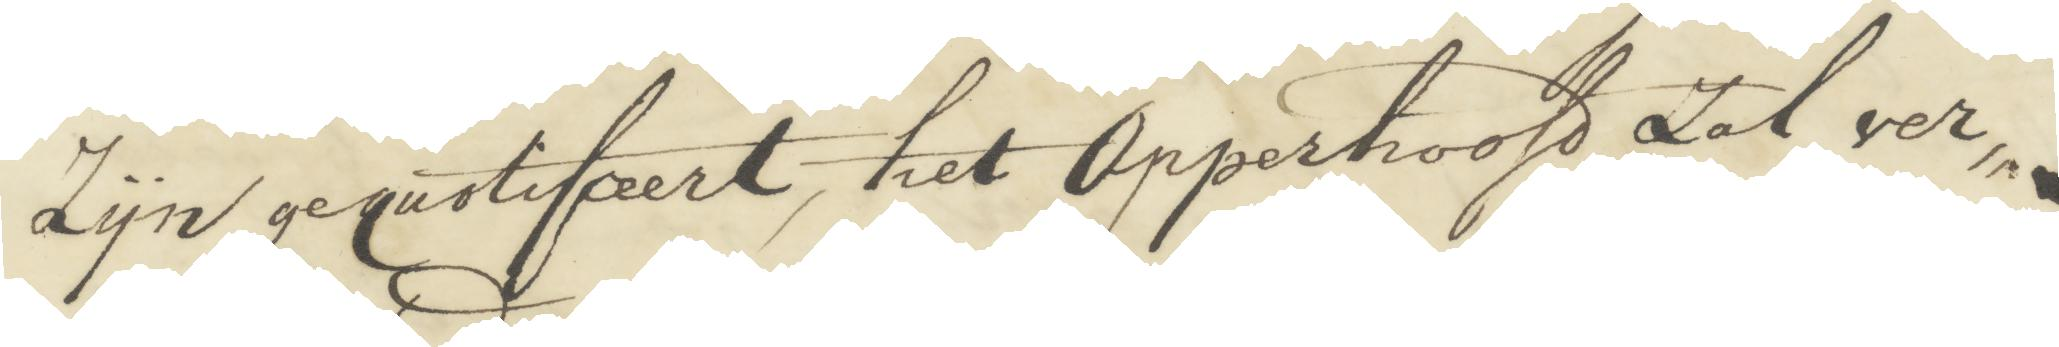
zijn gequotiseert, het Opperhoofd zal ver„
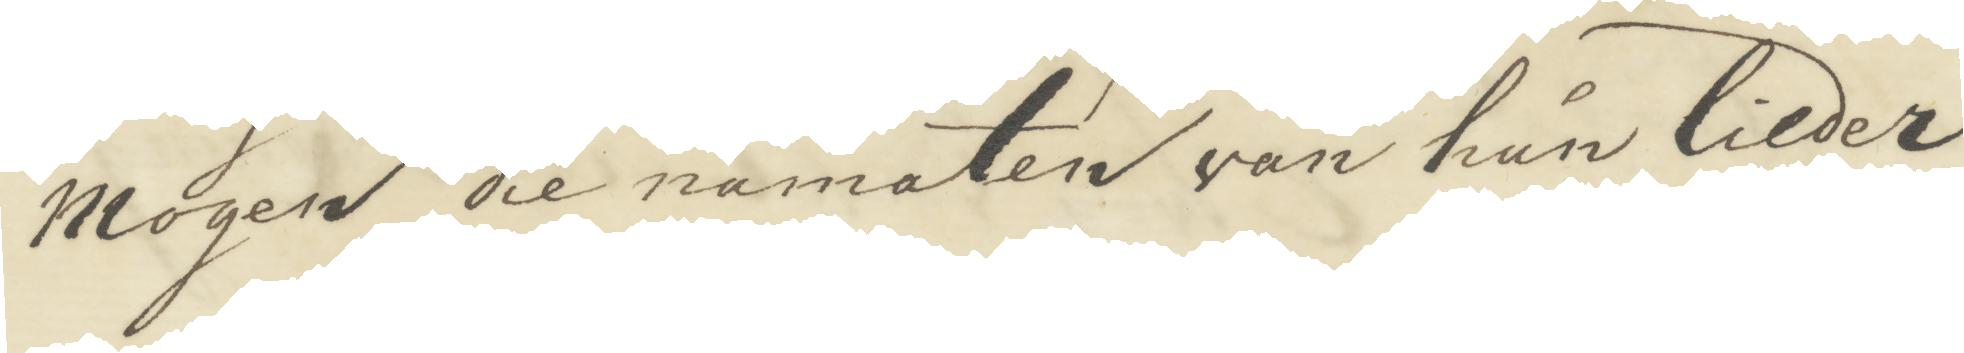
mogen die namaten van hun lieder
